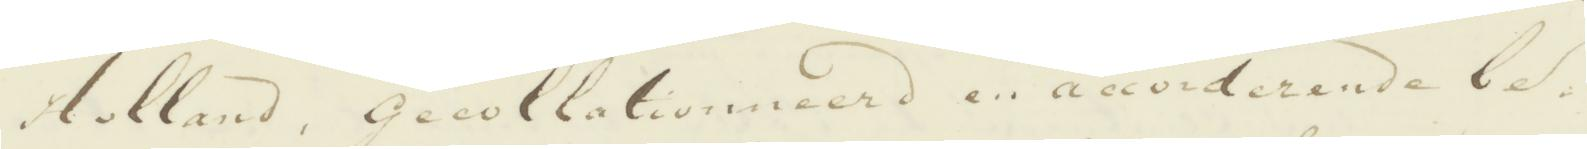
Holland, gecollationneerd en accorderende be„
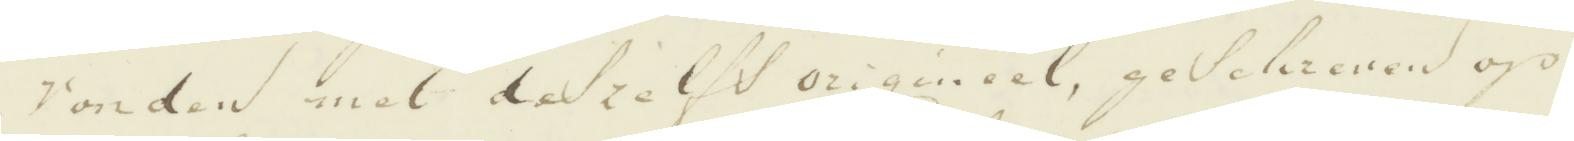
vonden met deszelfs origineel, geschreven op
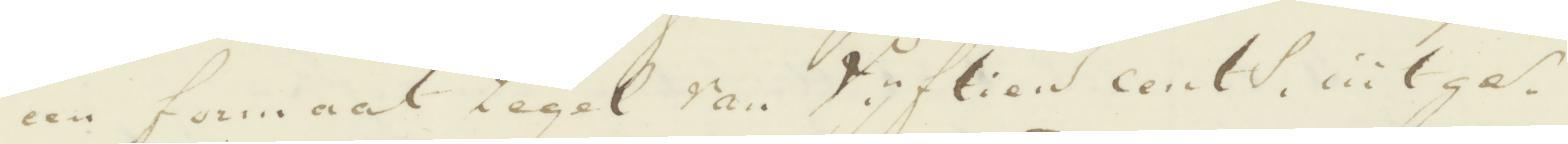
een formaat zegel van Vyftien cents, uitge„
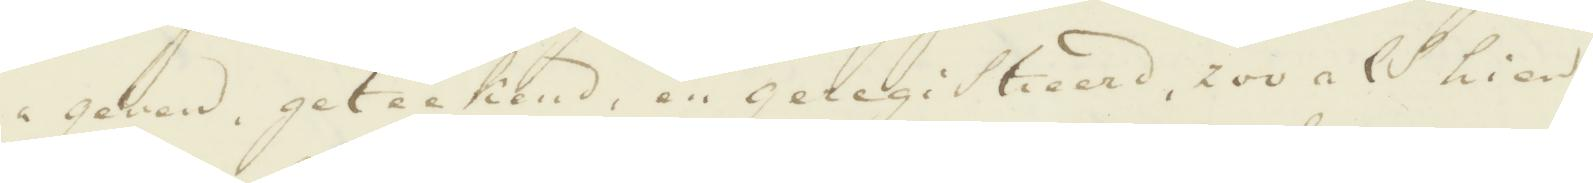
„geven, geteekend, en geregistreerd, zoo als hier
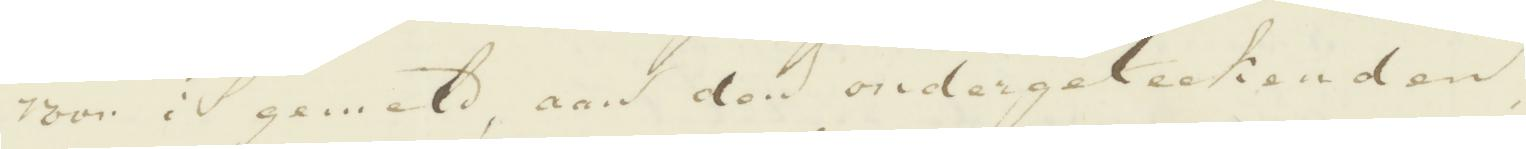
voor is gemeld, aan den ondergeteekenden
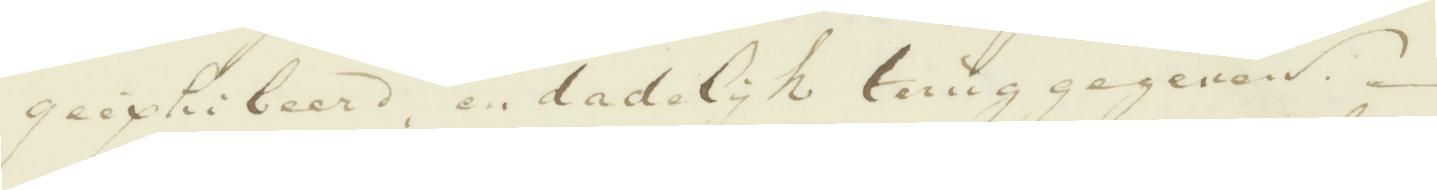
geëxhibeerd, en dadelijk teruggegeven.
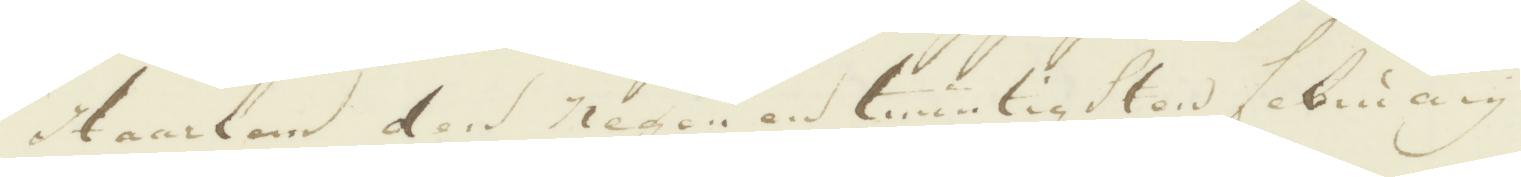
Haarlem den negen en twintigsten februarij
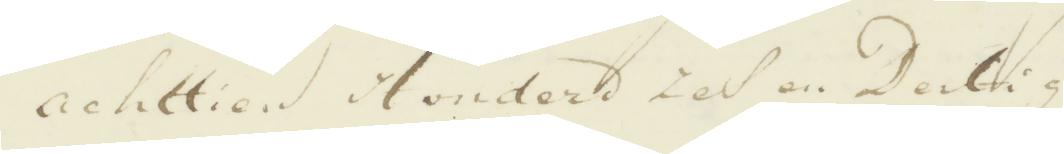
achttien Honderd zes en Dertig
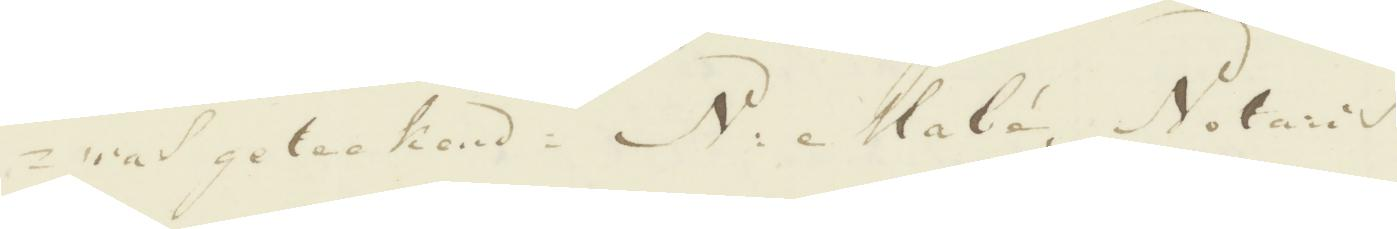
=was geteekend= N: Mabé, Notaris
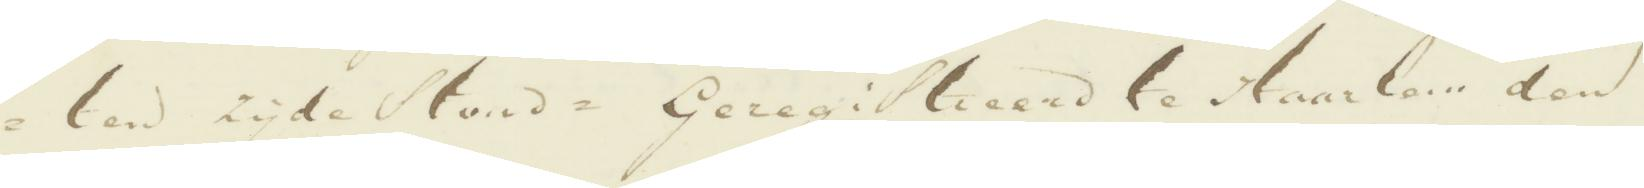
=ter zijde stond= Geregistreerd te Haarlem den
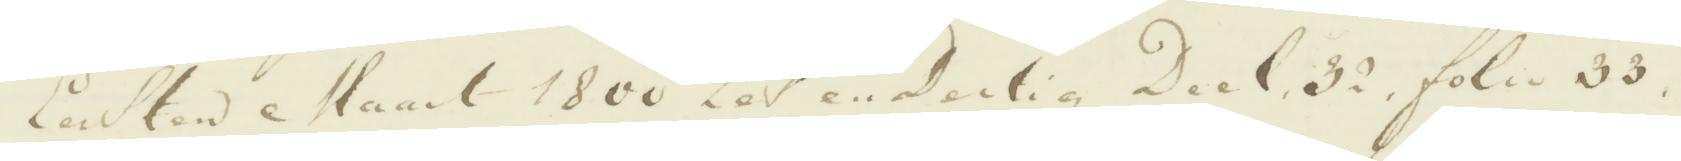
Eersten Maart 1800 zes en Dertig, Deel, 32, folio 33,
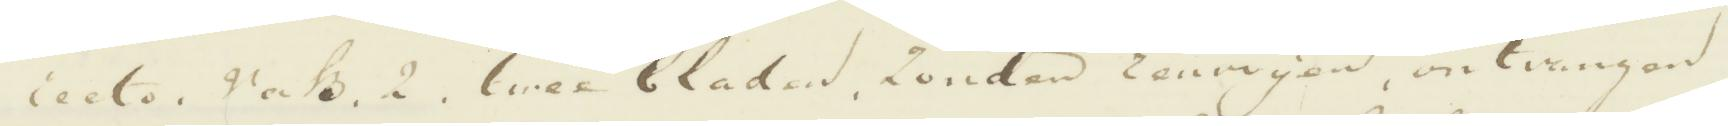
recto, Vak, 2, twee bladen, zonder renvoijen, ontvangen
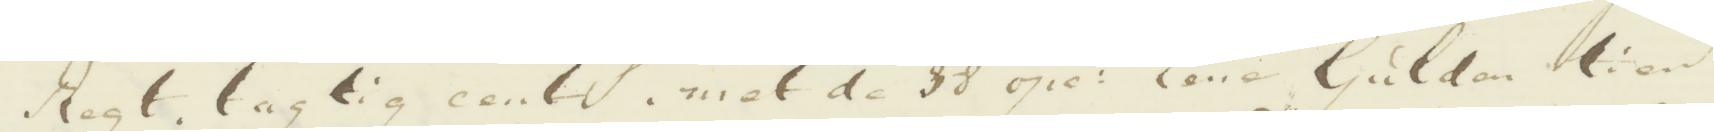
Regt, tagtig cents, met de 38 opc: Eene Gulden tien
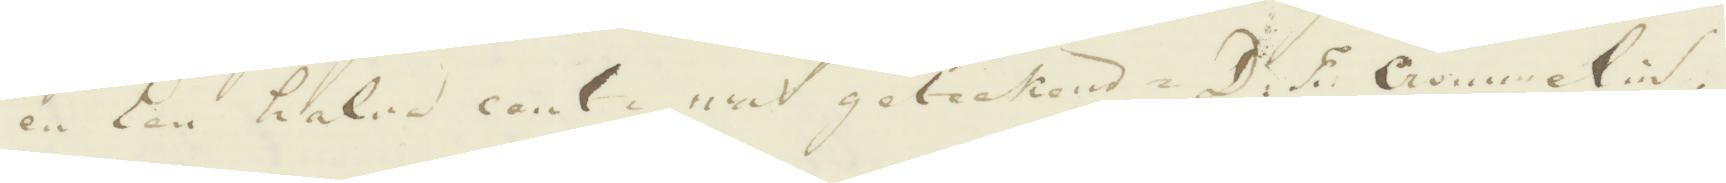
en Een halve cent = was geteekend = D: F: Crommelis.
